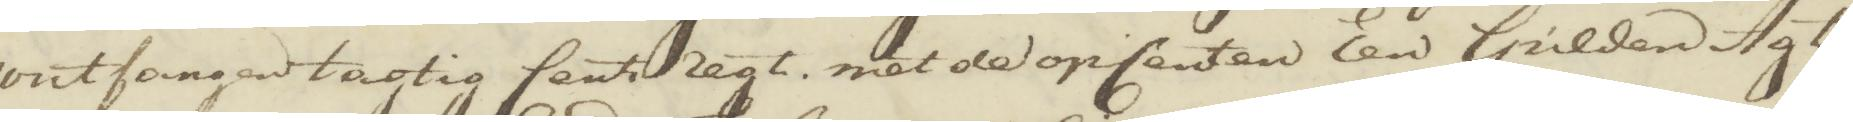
ontfangen tagtig Cents regt. met de opcenten Een Gulden Agt
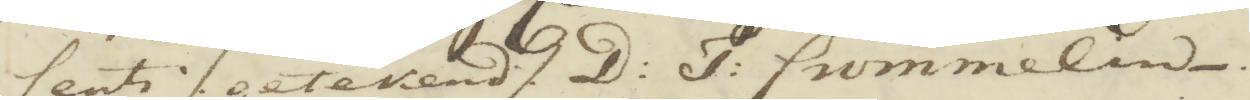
Cents ./. getekend ./. D: F: Crommelin – .
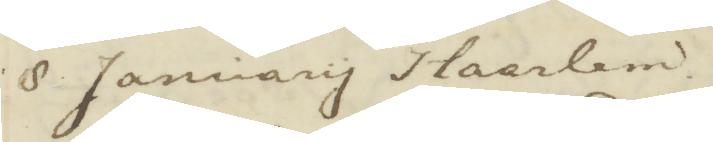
8 Januarij Haarlem.
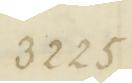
3225
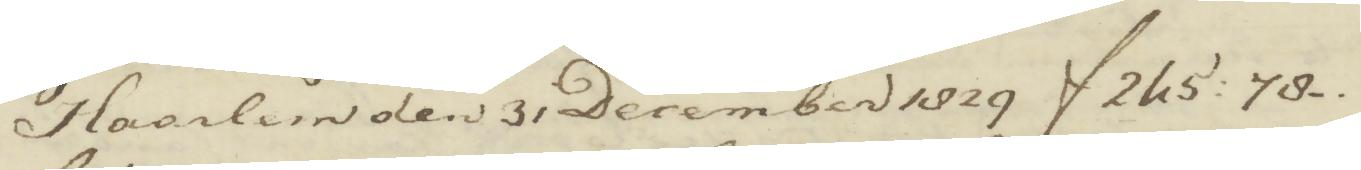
Haarlem den 31 December 1829 ƒ245: 78- .
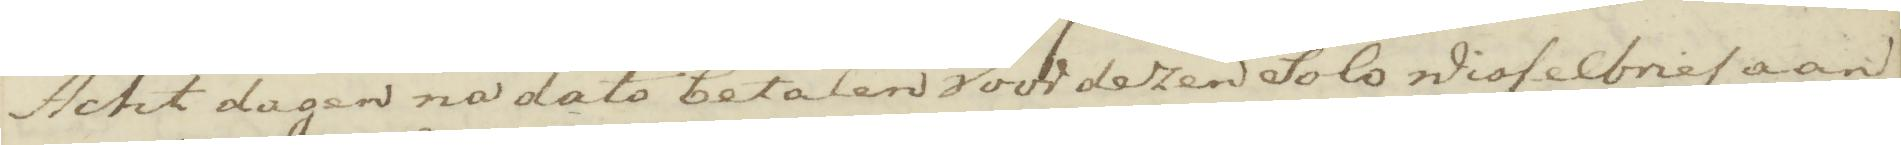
Acht dagen na dato betalen Voor dezen Solo wisselbrief aan
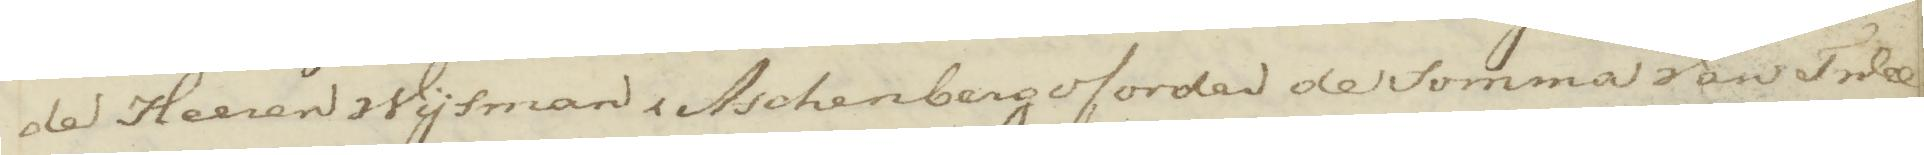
de Heeren Wijsman & Aschenberg of order de somma Van Twee
